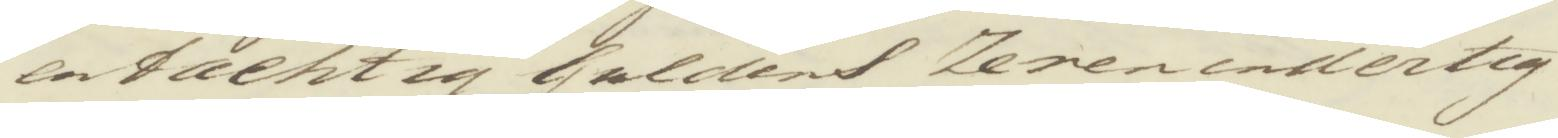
en tachtig Guldens zeven en dertig
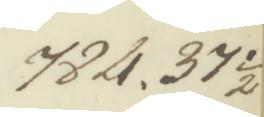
784.37½
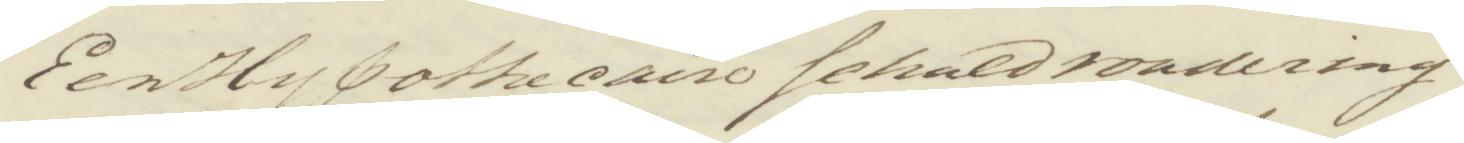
Een Hypothecaire schuldvordering
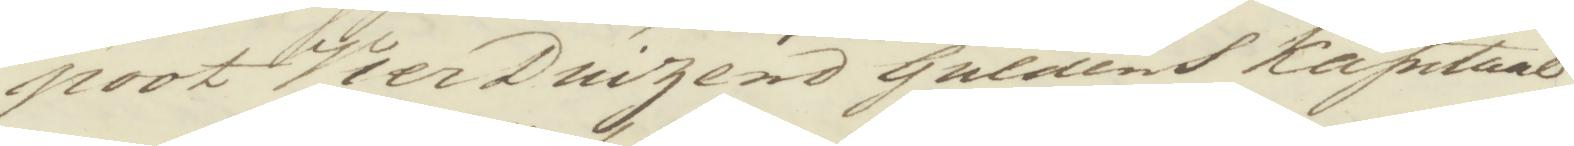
groot Vier Duizend Guldens Kapitaal,
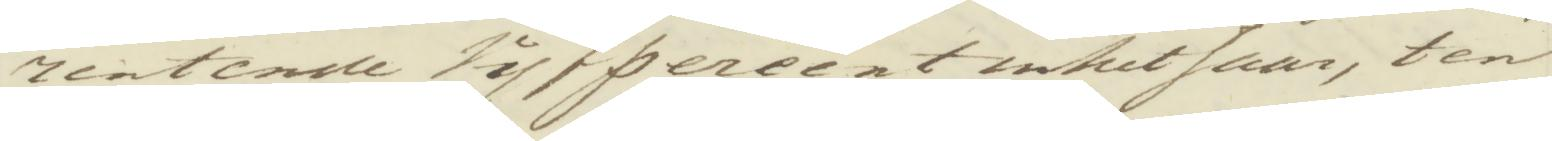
rentende Vyf percent in het Jaar, ten
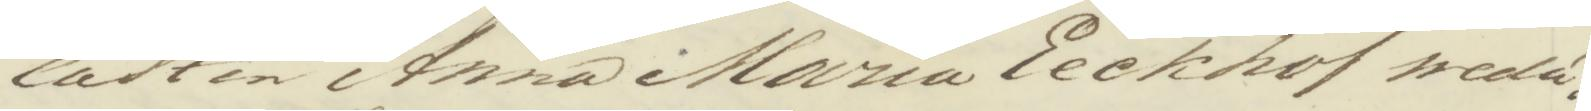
lasten Anna Maria Eeckhof wedu„
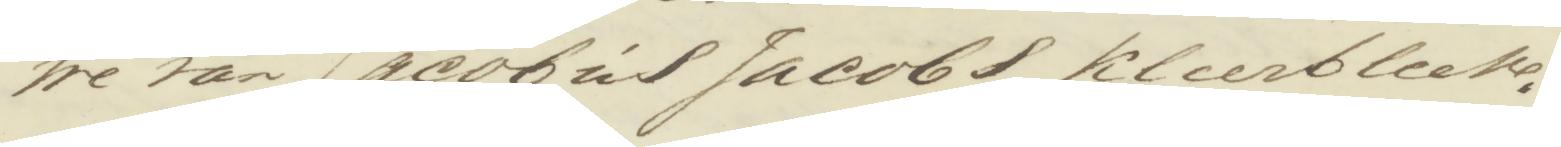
we van Jacobus Jacobs, kleerbleek„
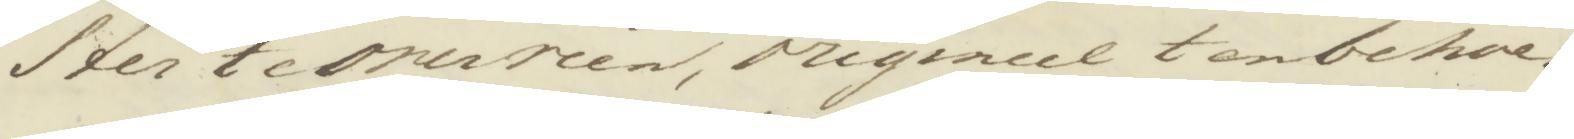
ster te overveen, origineel ten behoe„
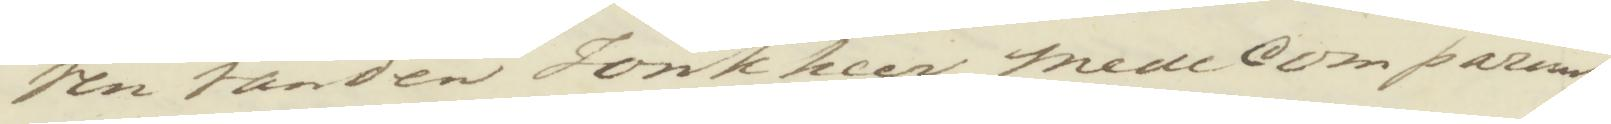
ven van den Ionkheer medecomparant
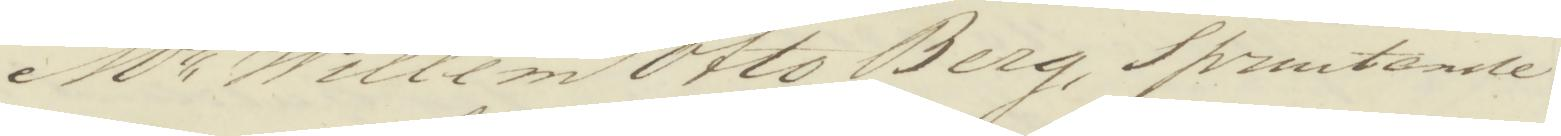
M„r Willem Otto Berg, spruitende
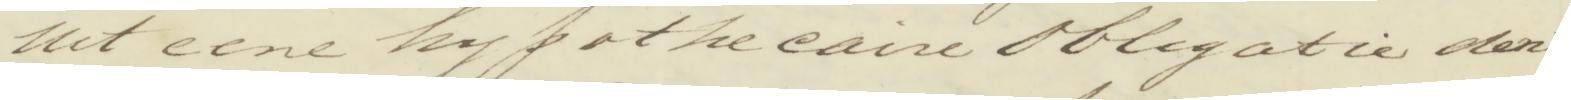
uit eene hypothecaire Obligatie den
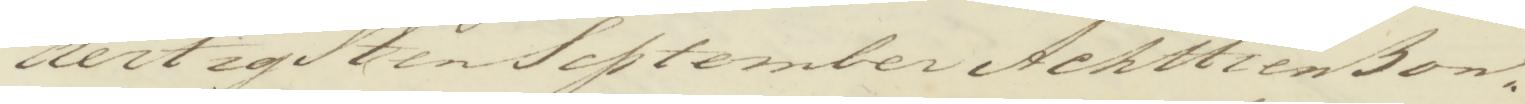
dertigsten September Achttien Hon„
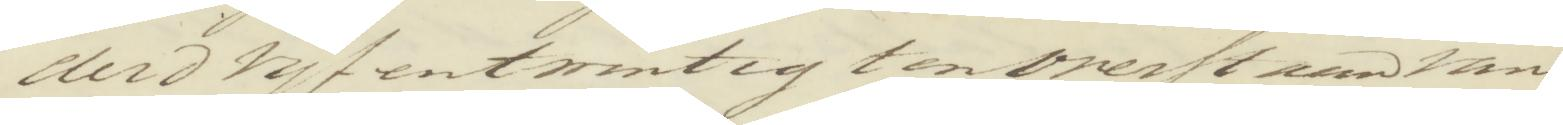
derd Vyf en twintig ten overstaan van
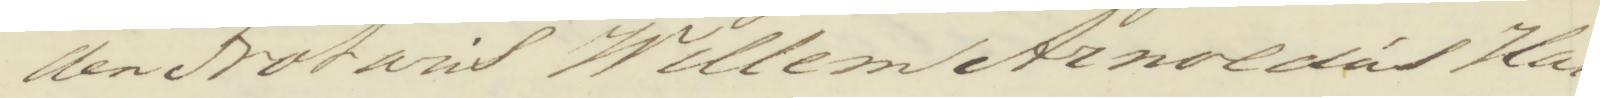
den Notaris Willem Arnoldus Ha
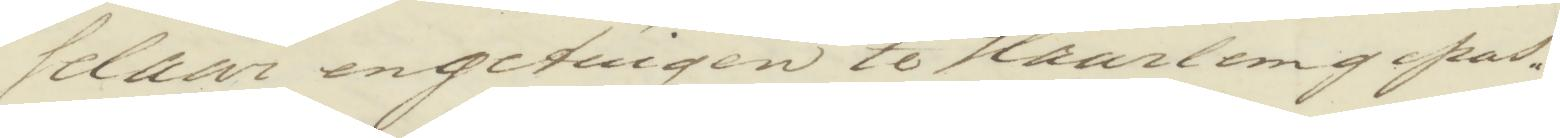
selaar en getuigen te Haarlem gepas„
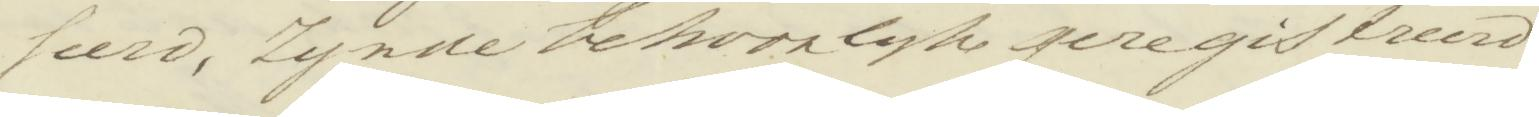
seerd, zynde behoorlyk geregistreerd
